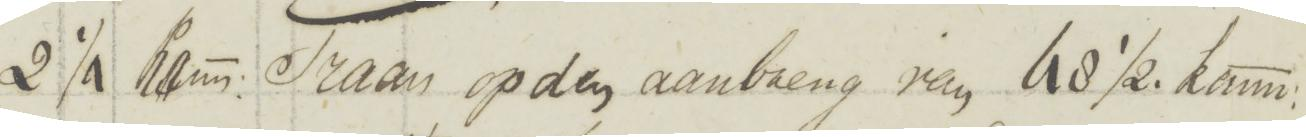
2¼ kann: Traan op den aanbreng van 48½. kann:
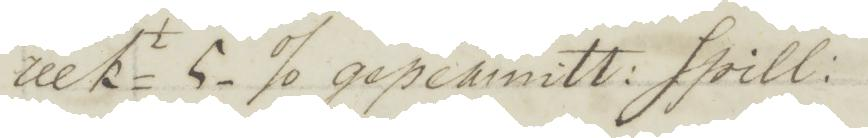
reek=t 5- % gepermitt: spill:
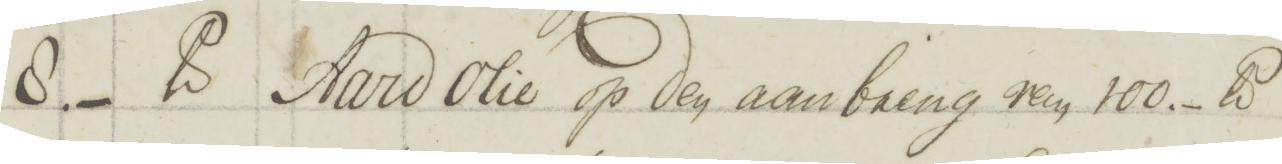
8._ lb Aard Olie op den aanbreng van 100.– lb
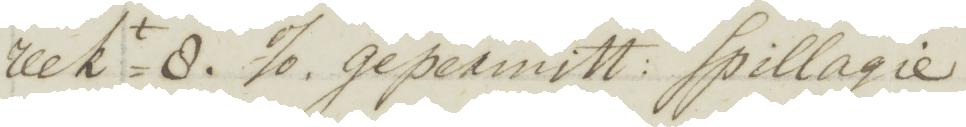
reek=t 8. %. gepermitt: spillagie
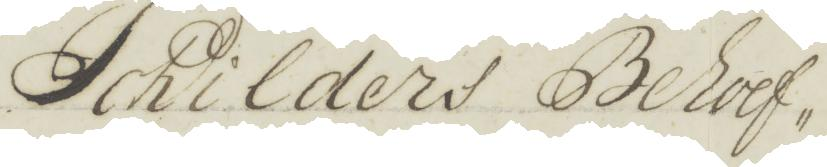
Schilders Behoef„
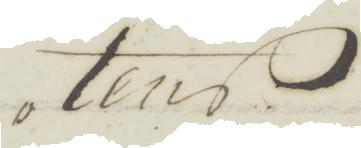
„ tens
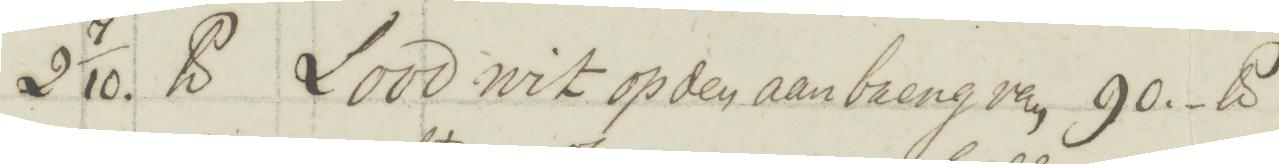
2 7/10. lb Lood wit op den aanbreng van 90.- lb
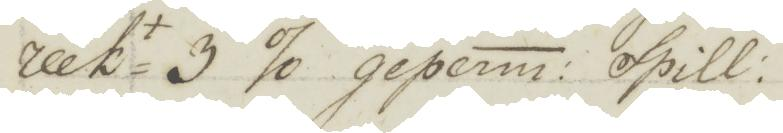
reek=t 3 % geperm: spill:
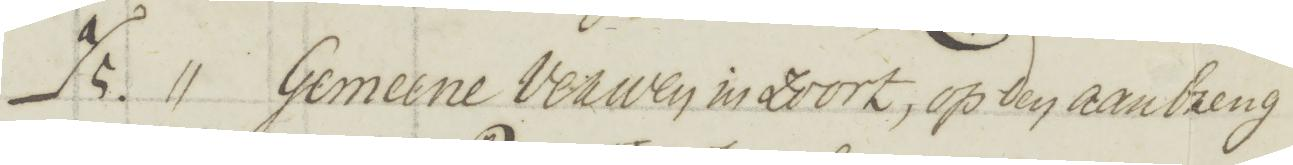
_4/5. „ Gemeene verwen in zoort, op den aanbreng
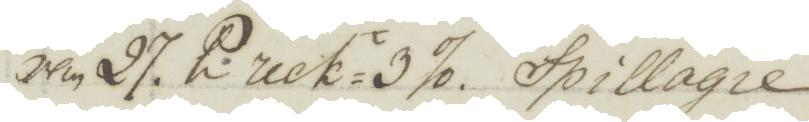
van 27.lb reck:t 3 %. spillagie
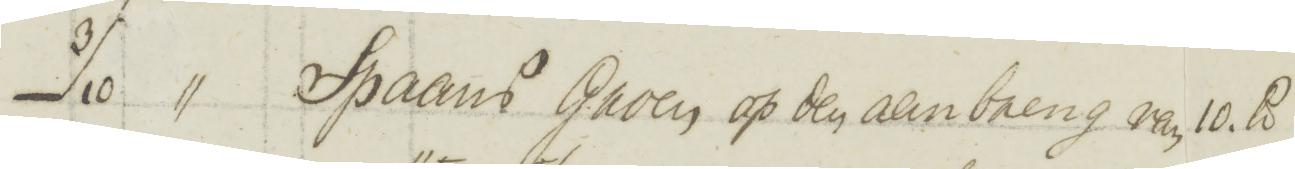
_3/10 „ Spaans Groen op den aanbreng van 10. lb
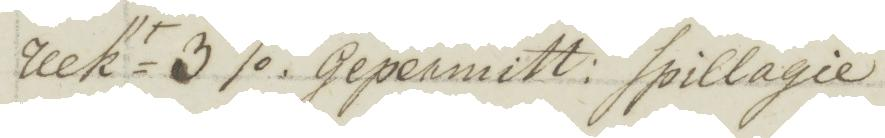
reek=t 3 %. gepermitt: spillagie
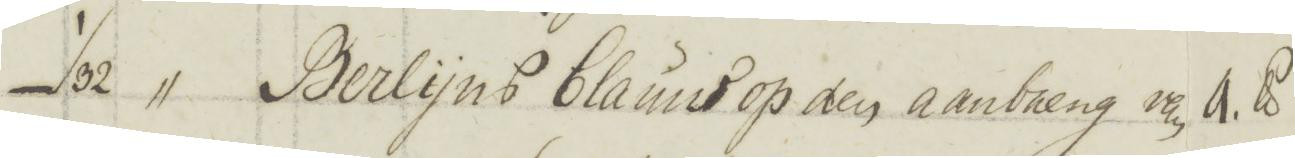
_1/32 „ Berlijns blauw op den aanbreng van 4. lb
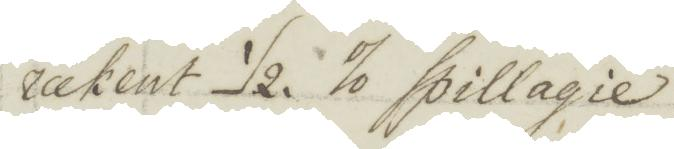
reekent 1/2. % spillagie
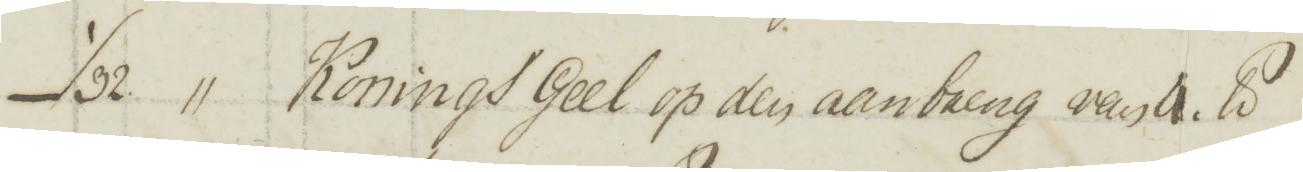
_1/32. „ Konings geel op den aanbreng van 4. lb
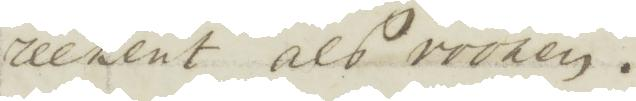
reekent als vooren.
